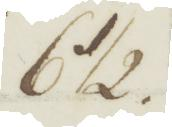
6 1/2.
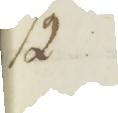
1/2
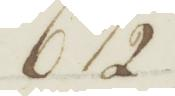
6 1/2
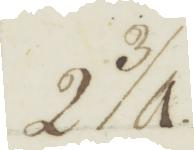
2 3/4.
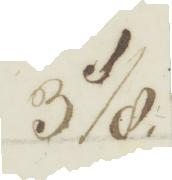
3 1/8.
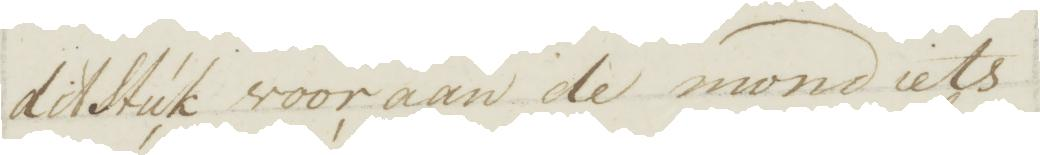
dit stuk voor aan de mond iets
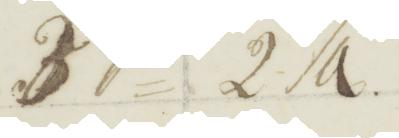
3 d=m 2 1/4.
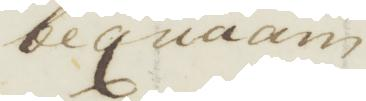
bequaam
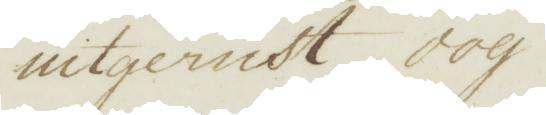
uitgerust dog
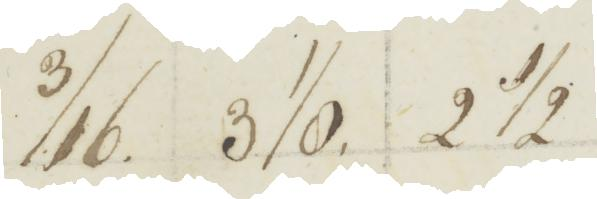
3/16. 3 1/8. 2 1/2
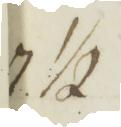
7 1/2
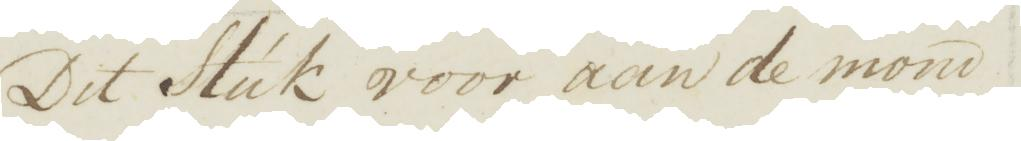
Dit stuk voor aan de mond
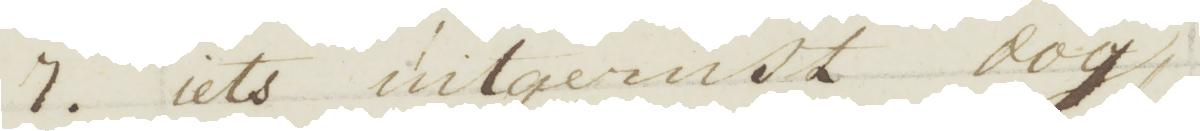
7. iets uitgerust dog„
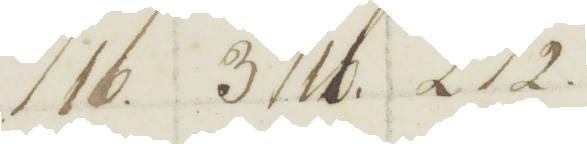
3 1/16. 3 7/16. 2 1/2.
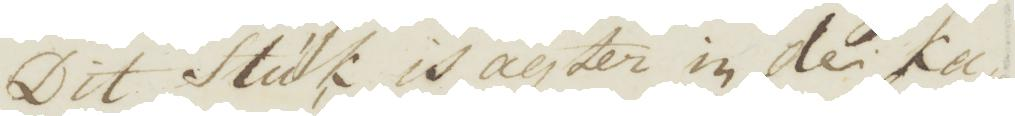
Dit stuk is agter in de ka„
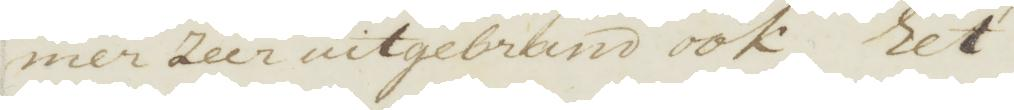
mer zeer uitgebrand ook het
